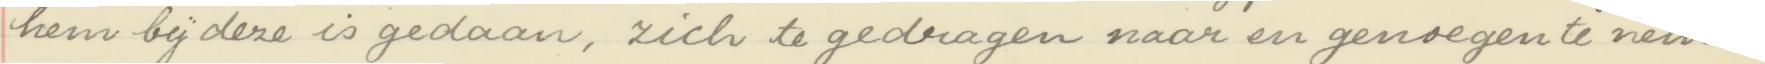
hem bij deze is gedaan, zich te gedragen naar en genoegen te nemen
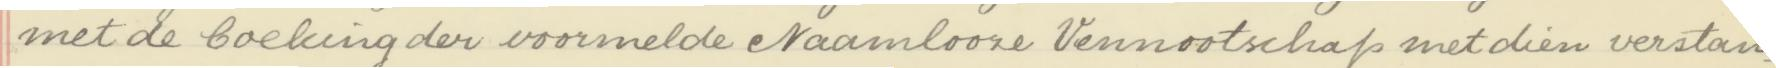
met de boeking der voormelde Naamlooze Vennootschap met dien verstan
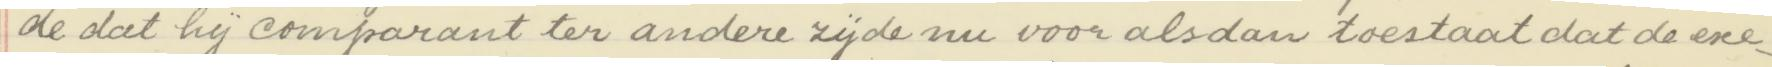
de dat hij comparant ter andere zijde nu voor als dan toestaat dat de exe
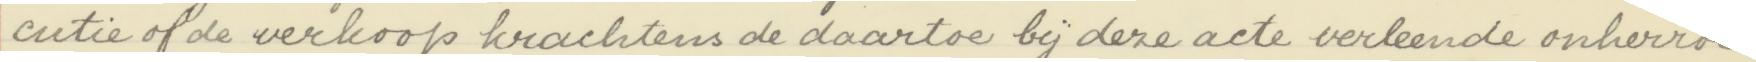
cutie of de verkoop krachtens de daartoe bij deze acte verleende onherroe
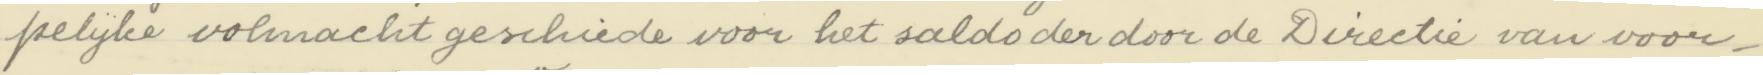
pelijke volmacht geschiede voor het saldo der door de Directie van voor-
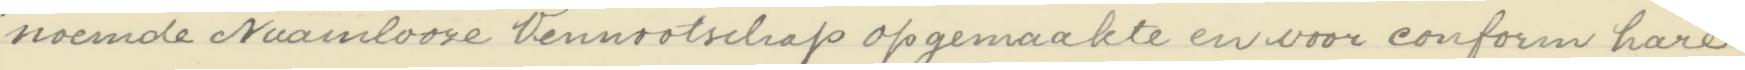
noemde Naamlooze Vennootschap opgemaakte en voor conform hare
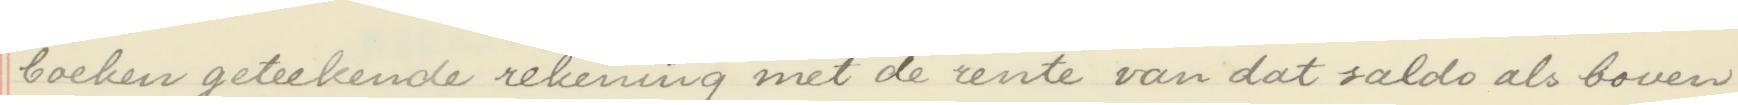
boeken geteekende rekening met de rente van dat saldo als boven
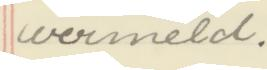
vermeld
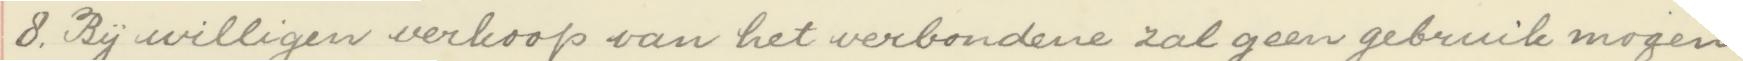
8. Bij willigen verkoop van het verbondene zal geen gebruik mogen
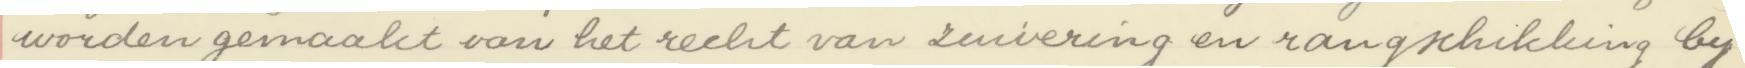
worden gemaakt van het recht van zuivering en rangschikking bij
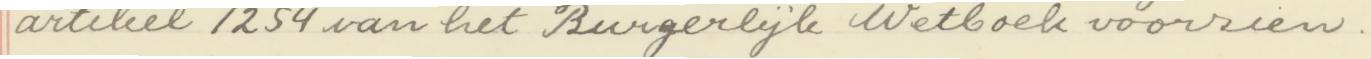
artikel 1254 van het Burgerlijk Wetboek voorzien
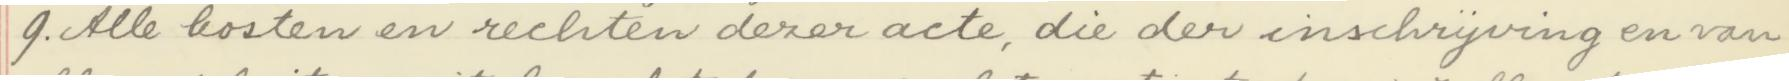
9. Alle kosten en rechten dezer acte, die der inschrijving en van
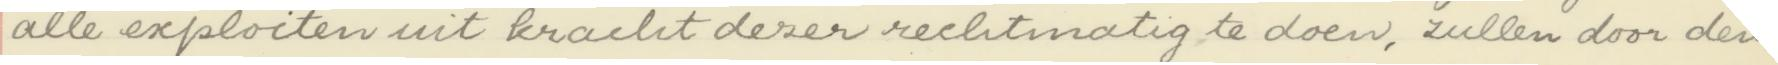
alle exploiten uit kracht dezer rechtmatig te doen, zullen door den
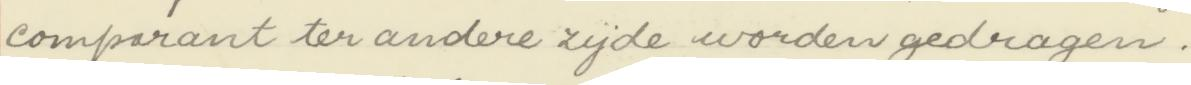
comparant ter andere zijde worden gedragen
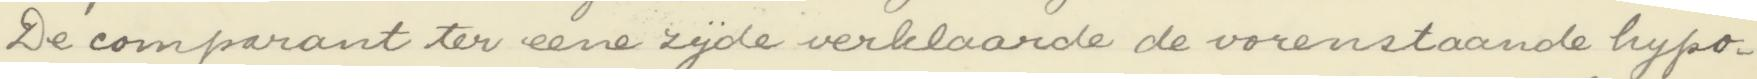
De comparant ter eene zijde verklaarde de vorenstaande hypo-
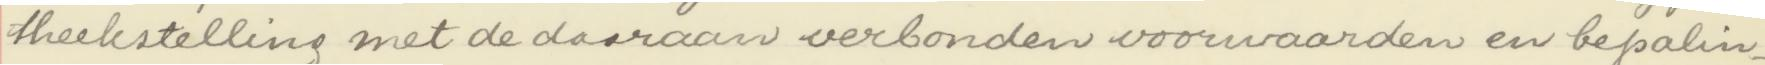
theekstelling met de daaraan verbonden voorwaarden en bepalin-
